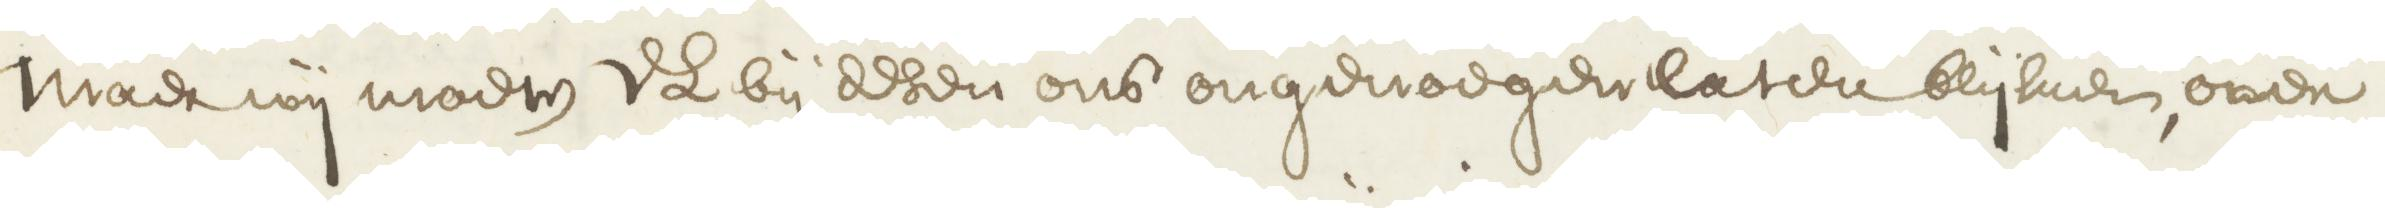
maer wij moeten VL bij desen ons ongenoegen laten blijken, over
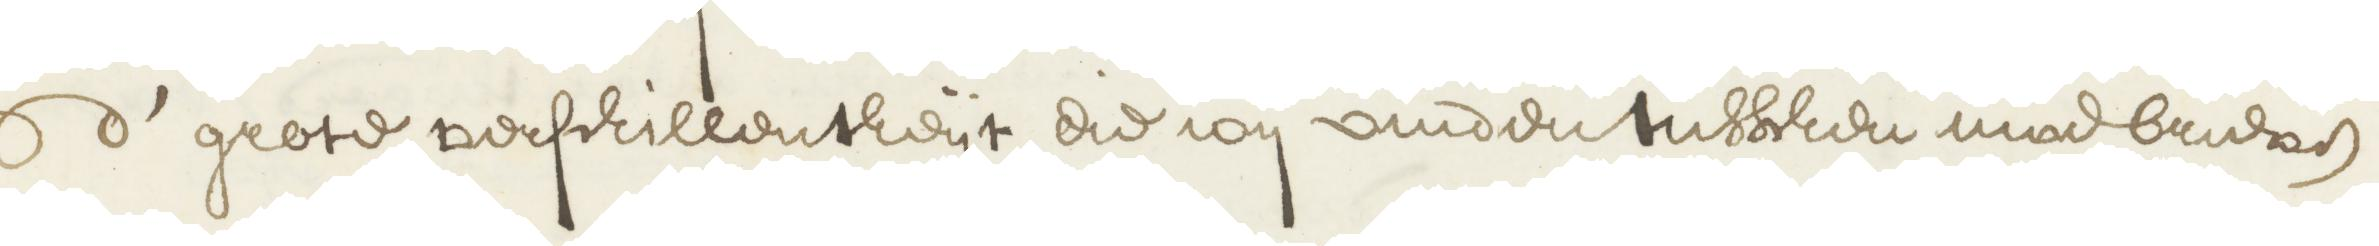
d' grote verschillentheijt die wij vinden tusschen uwe brieven
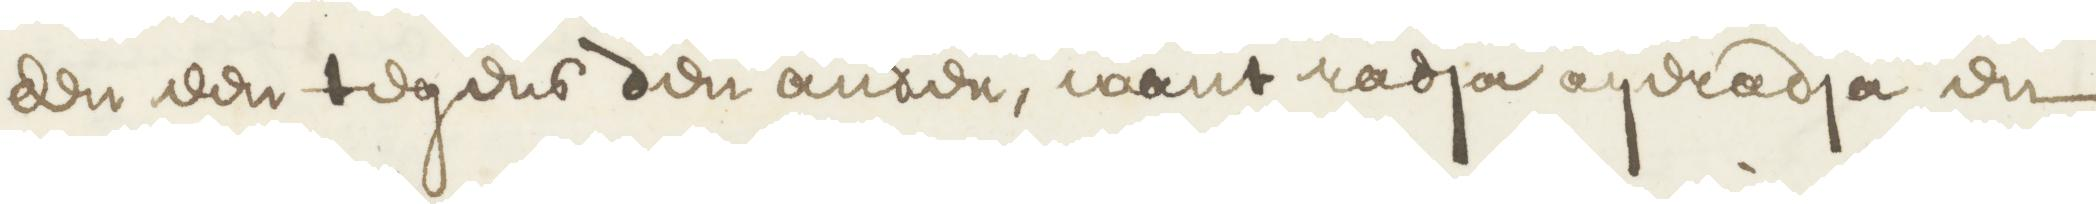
den een tegens den ander, want radja aijeradja en
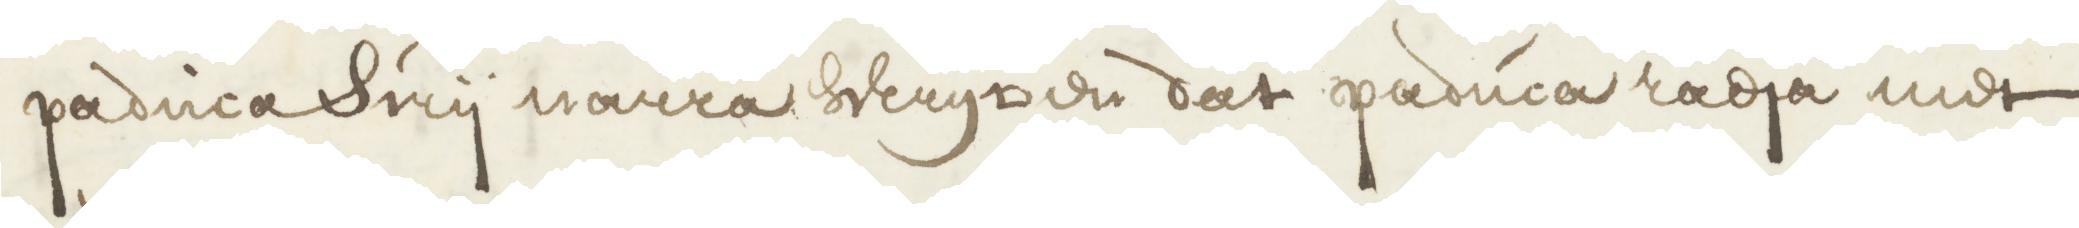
paduca Sirij narra schrijven dat paduca radja met
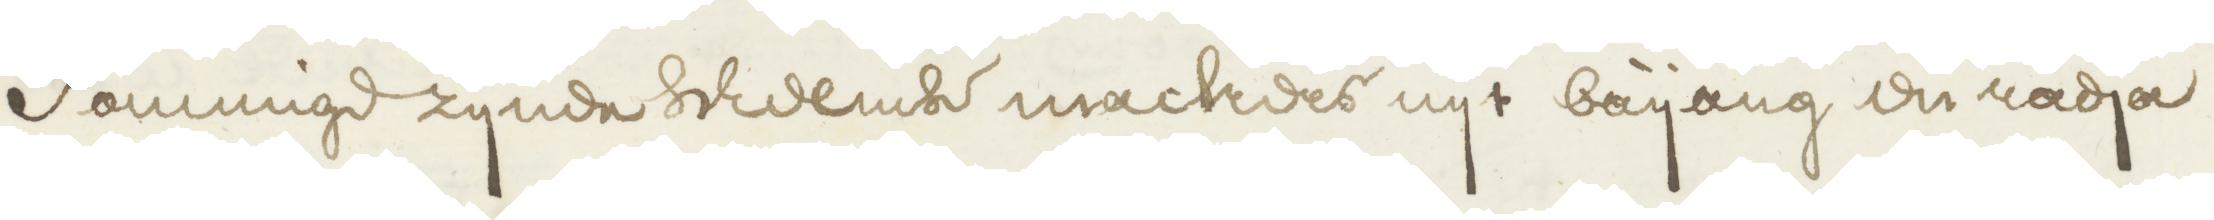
Sommige zijner schelmse mackers uijt baijang en radja
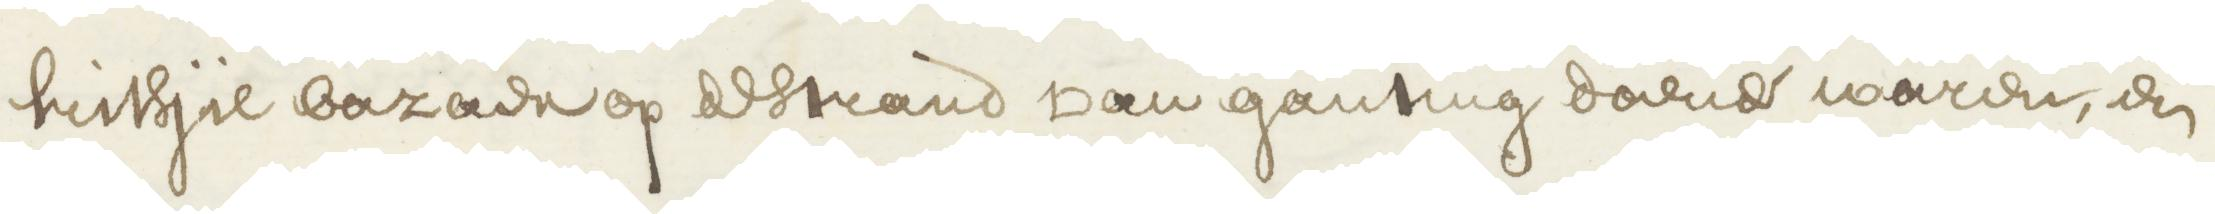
kithjil bazaer op de strand van ganting doende waren, en
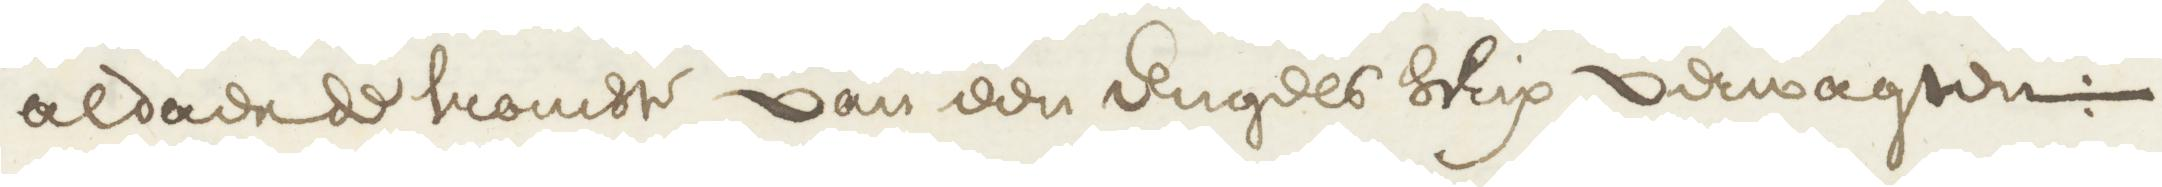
aldaer de komst van een Engels schip verwagten:
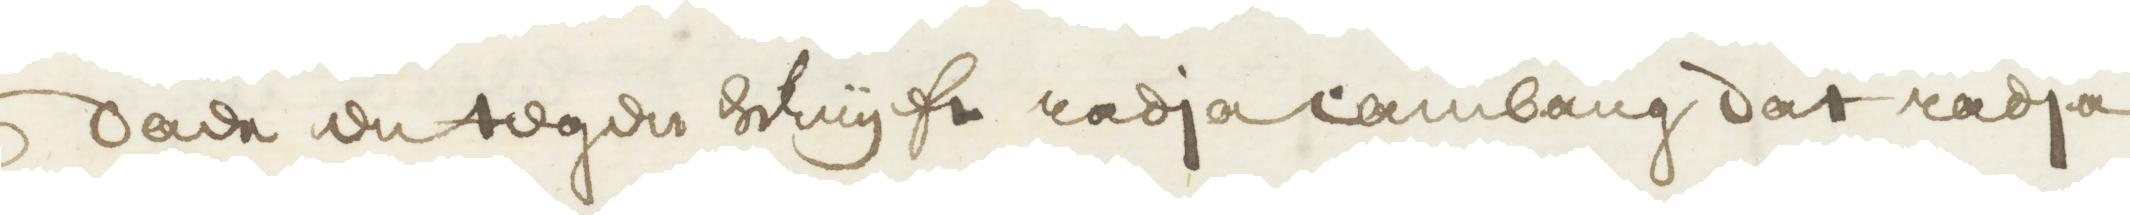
daer en tegen schrijft radja cambang dat radja
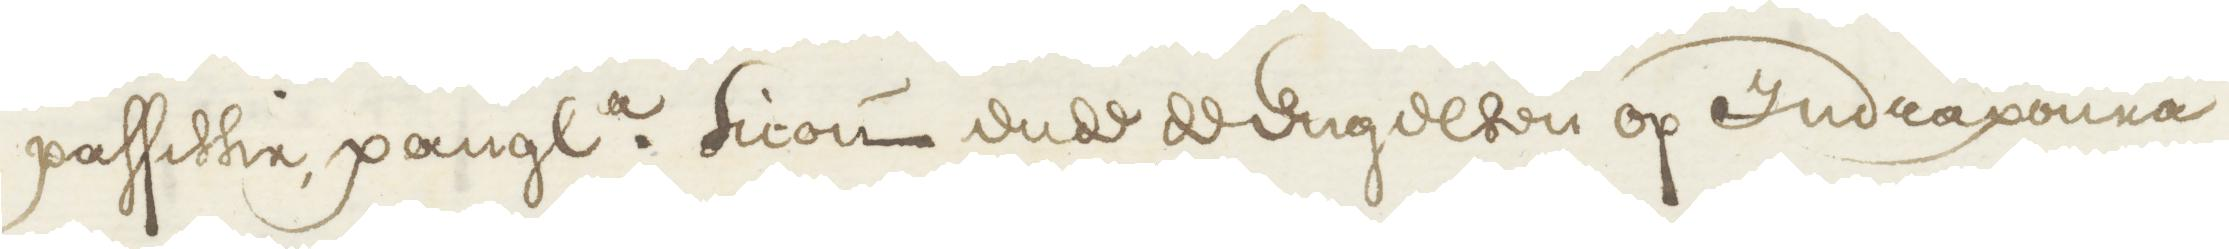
passissir, pangl:a Sicou ende de Engelsen op Indrapoura
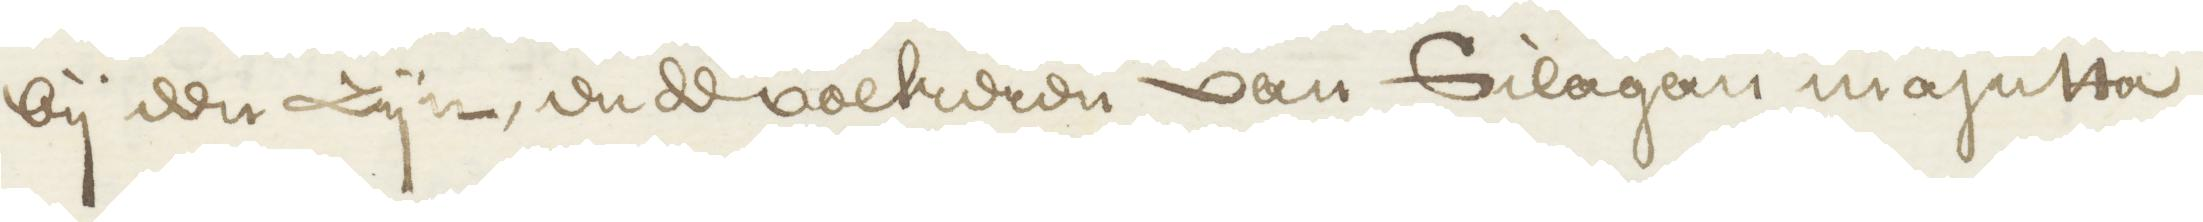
bij een Zijn, en de volkeren van Silagan majutta
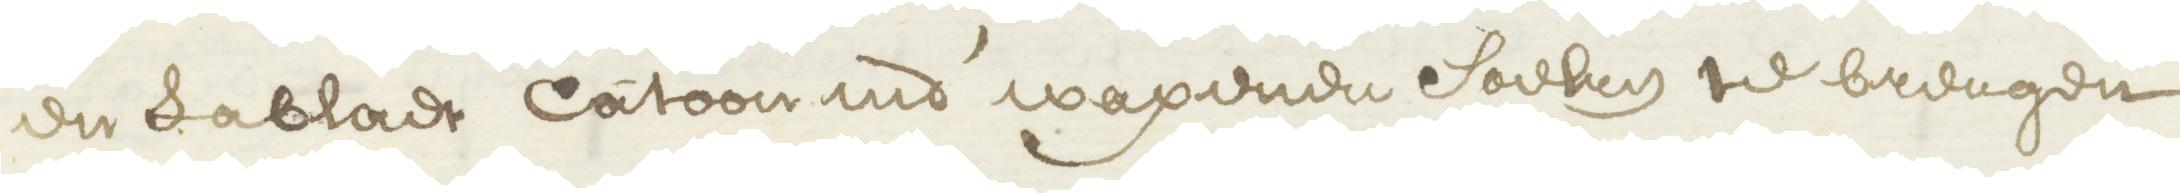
en sabhaer Catoon ind' wapenen soeken te brengen
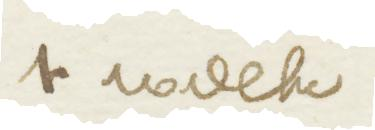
’t welk
